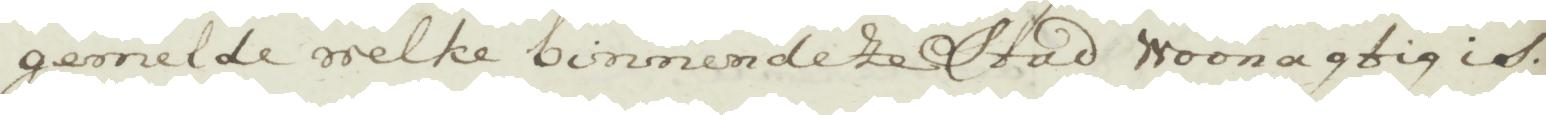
gemelde welke binnen deze Stad woonagtig is.
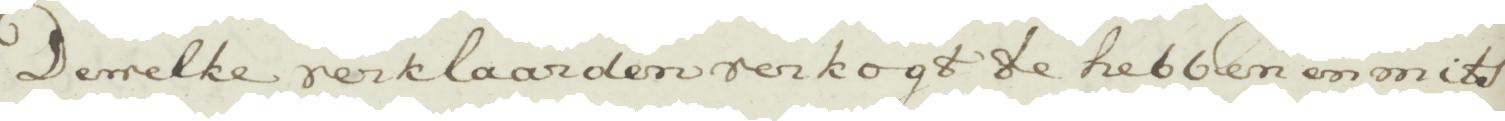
Dewelke verklaarden verkogt te hebben en mits
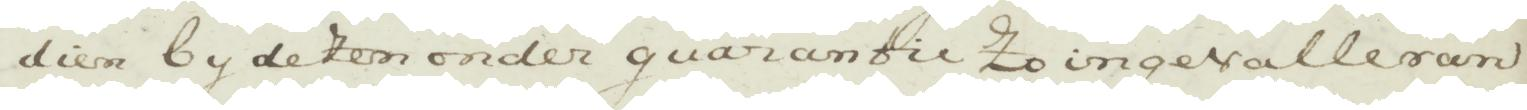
dien by dezen onder guarantie zo in gevalle van
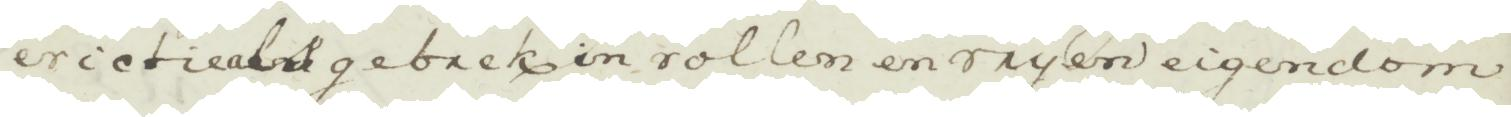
evictie als gebrek in vollen en vryen eigendom
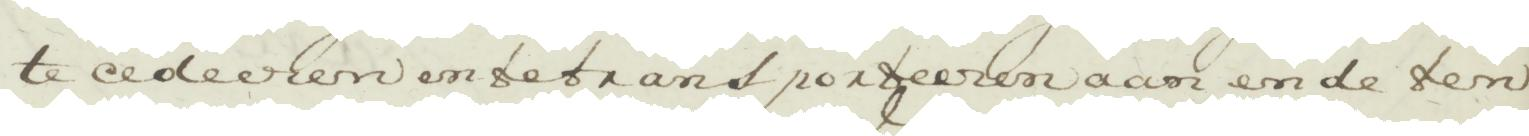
te cedeeren en te transporteeren aan en de ten
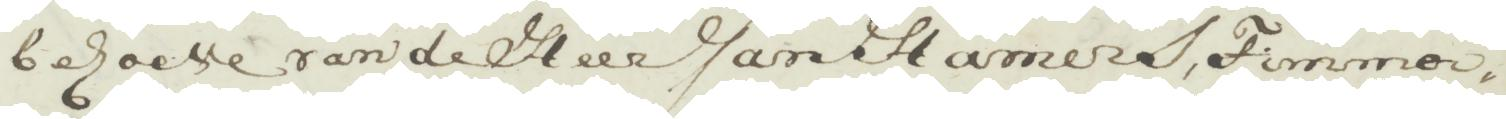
behoeve van de Heer Jan Hamers, Timmer„
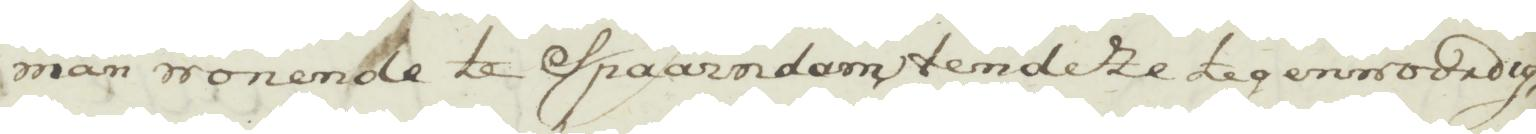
man wonende te Spaarndam ten deze tegenwoordig,
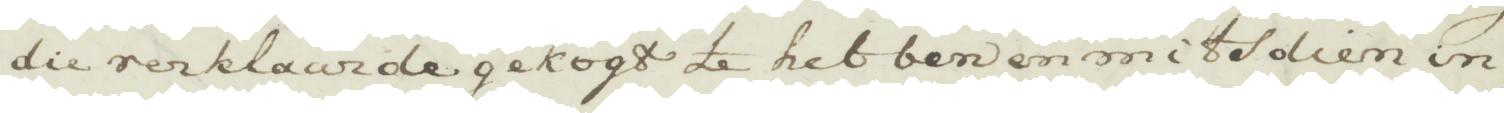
die verklaarde gekogt te hebben en mitsdien in
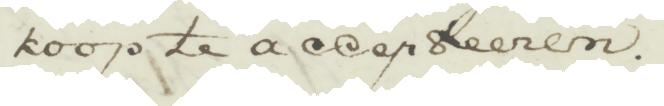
koop te accepteeren.
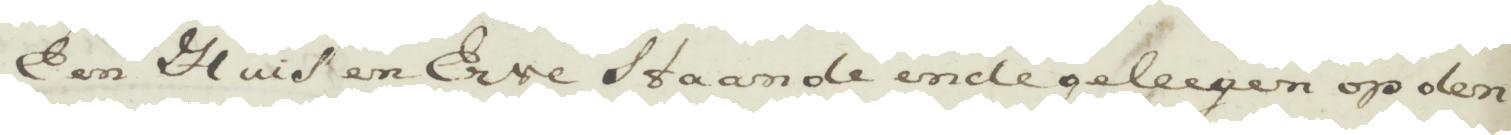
Een Huis en Erve staande ende geleegen op den
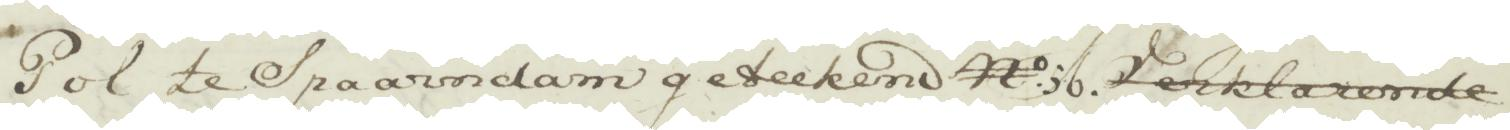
Pol te Spaarndam geteekend No=.56. Verklarende
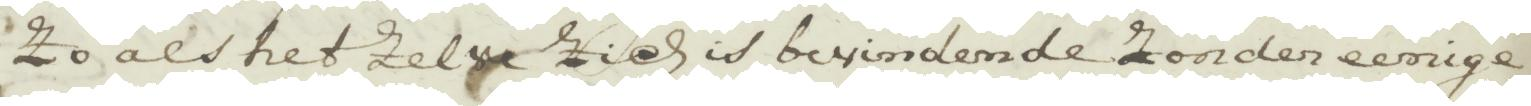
zo als het zelve zich is bevindende zonder eenige
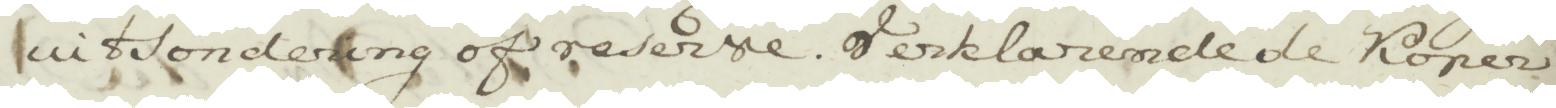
uitsondering of reserve. Verklarende de Koper
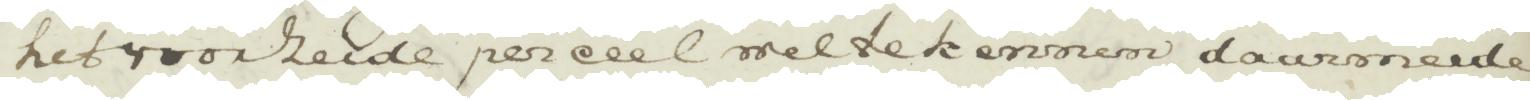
het voorzeide perceel wel te kennen daarmeede
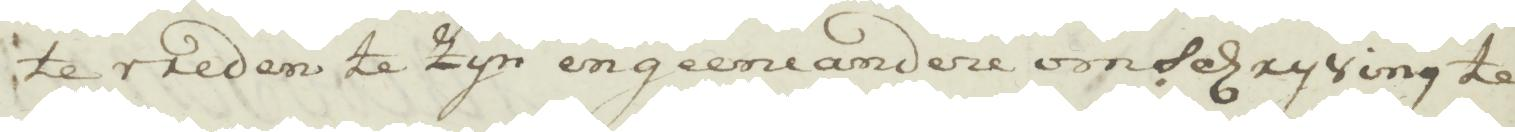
te vreden te zijn en geene andere omschrijving te
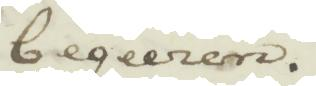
begeeren.
